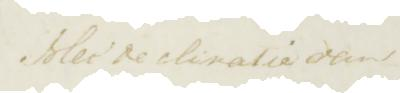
Alzo de eliratie van
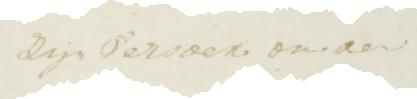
zijn verzoek om den
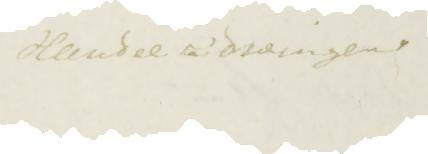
Handel te dwingen
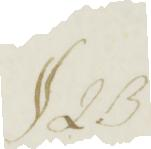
§ 23
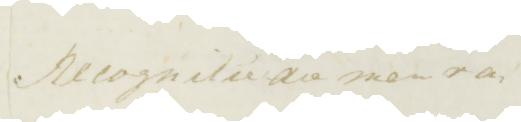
Recognitie die men van
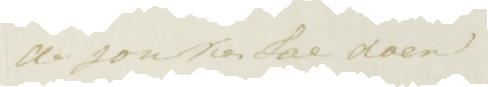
de jonken sal doen
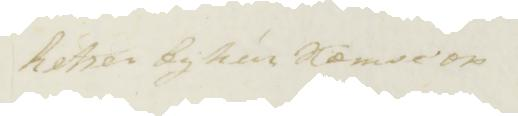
heffen bij hun komst op
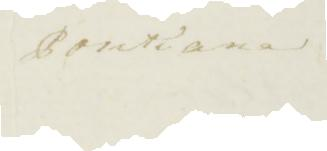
Pontiana
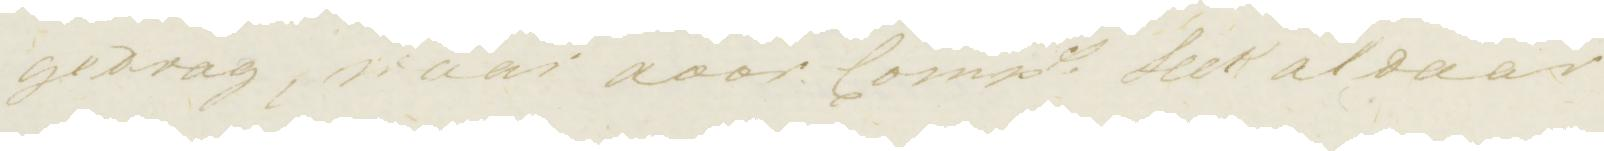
gedrag, waar door Comp.s het aldaar
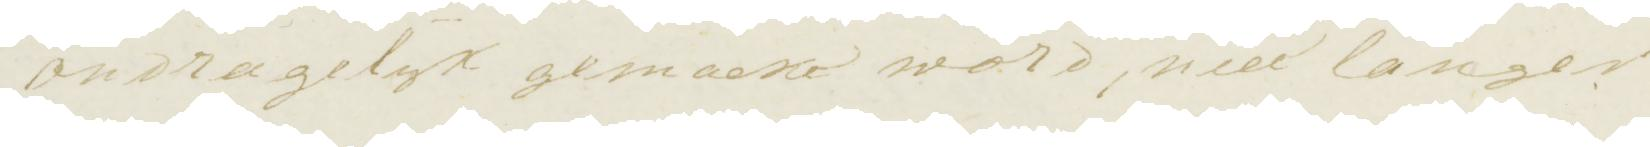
ondragelijk gemaekt word, niet langer
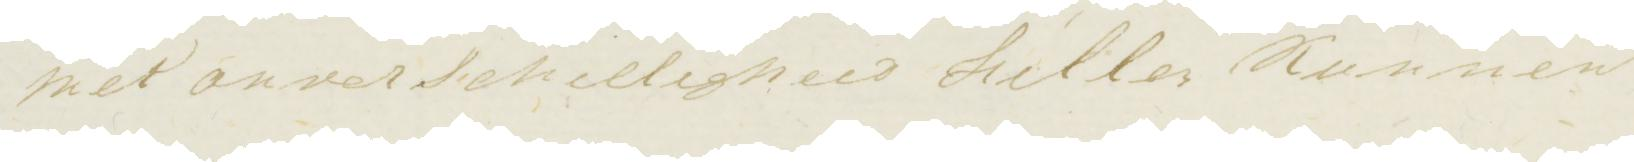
met onverschilligheid sullen kunnen
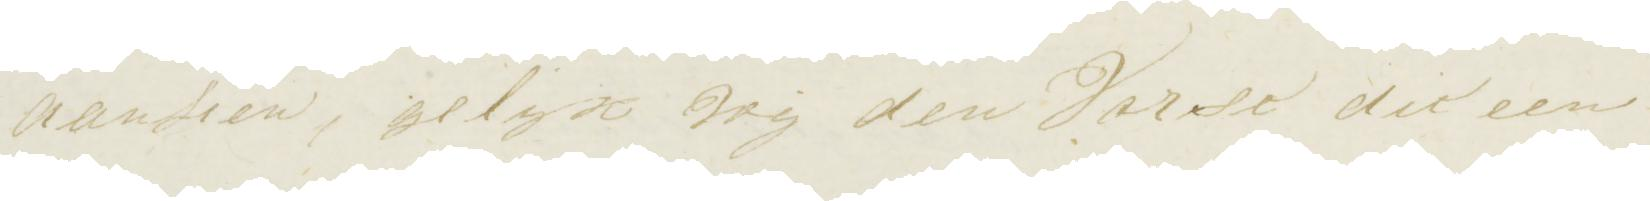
aansien, gelyk wij den Vorst dit een
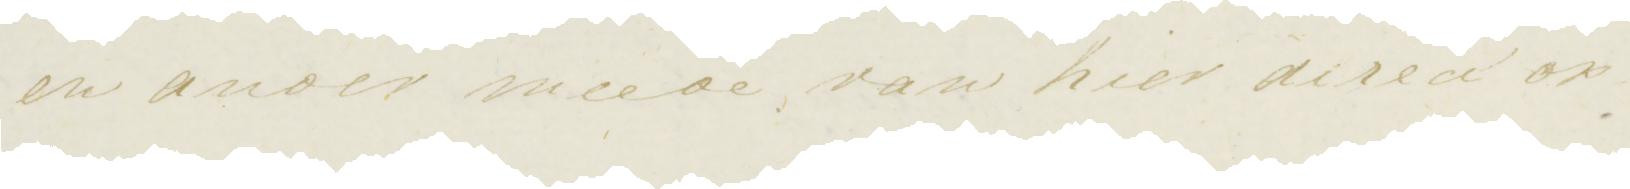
en ander meede van hier direct op
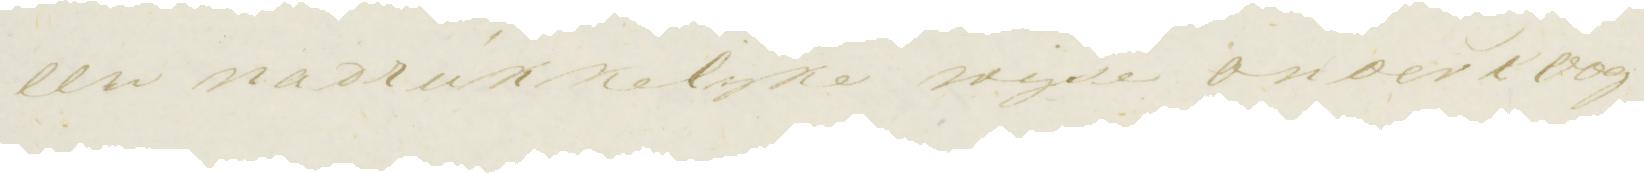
een nadrukkelijke wijse onder 't Oog
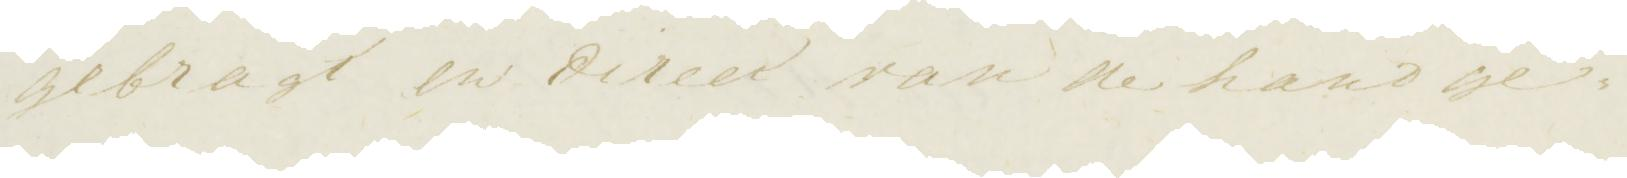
gebragt en direct van de hand ge„
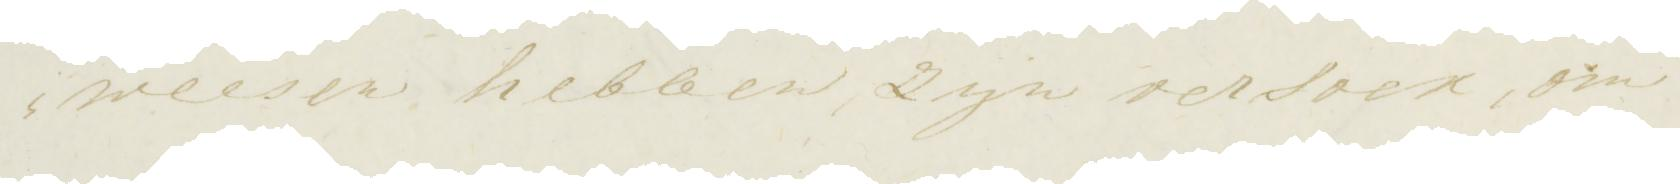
„weesen hebben, zijn versoek , om
